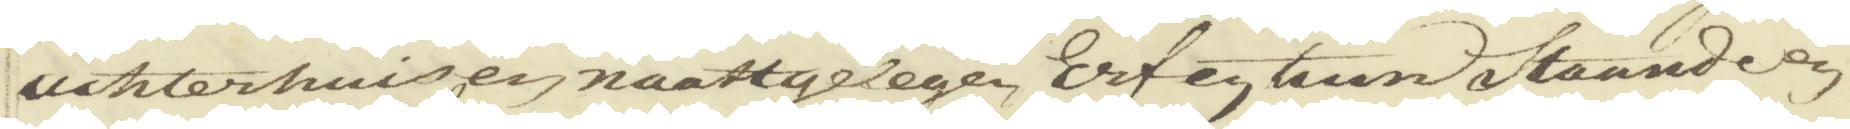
achterhuisen naastgelegen Erf en tuin staande en
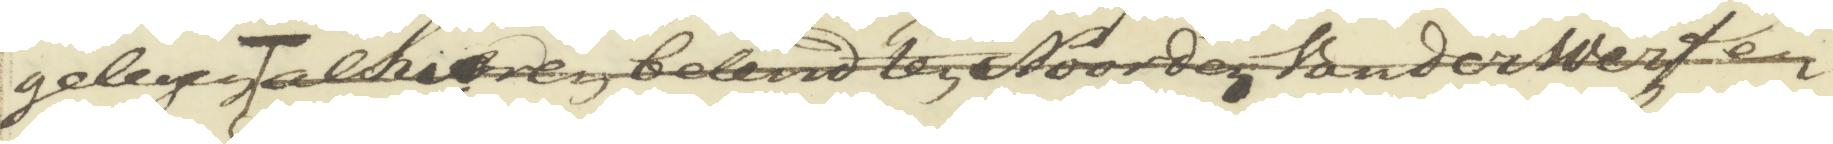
gelegen T alhier en belend ten Noorden Vander Werf en
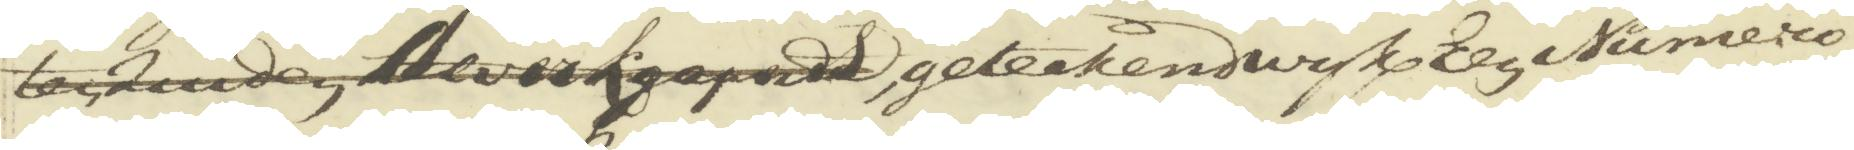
ten zuiden De verkgoperds, geteekend wyk Een Numero
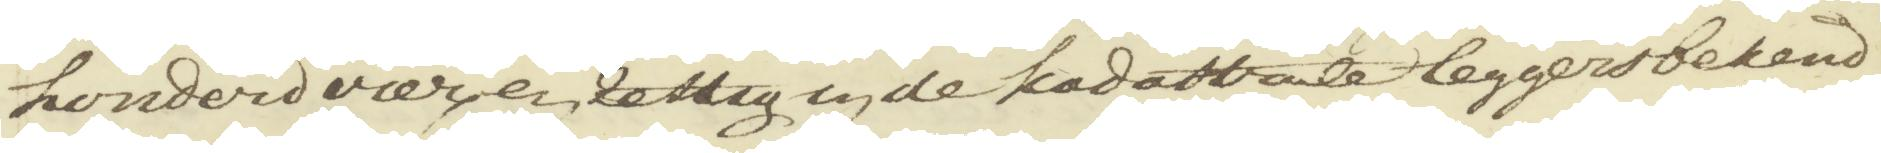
honderd vier en zestig in de kadastrale leggers bekend
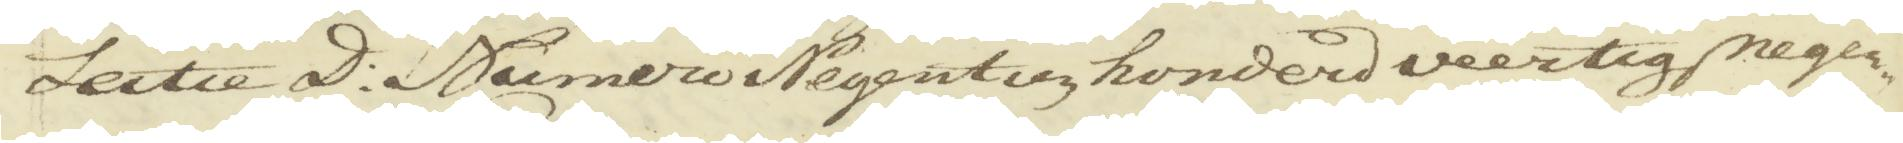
sectie D: Numero Negentien honderd veertig negen„
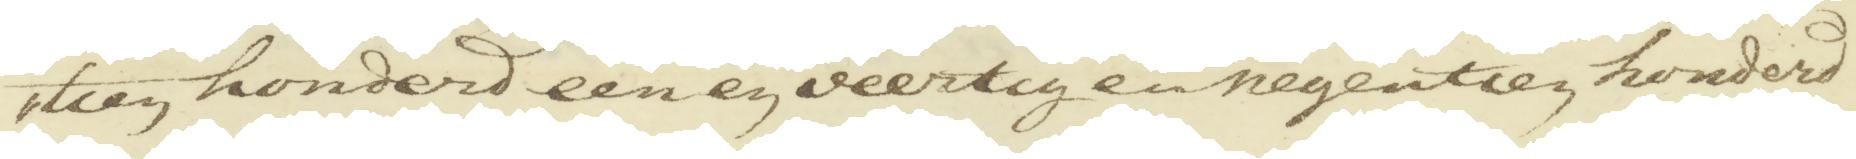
tien honderd een en veertig en negentien honderd
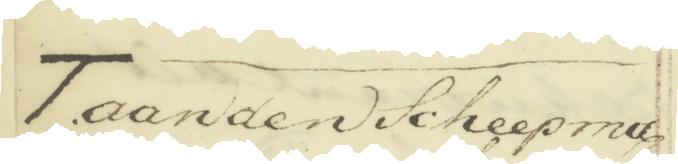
T. aan den scheepma
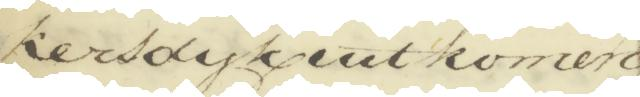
kersdyk uitkomend
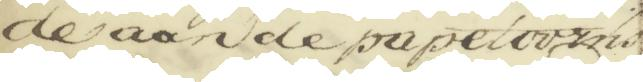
de aan de papeloorus
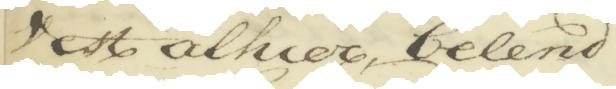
Vest alhier, belend
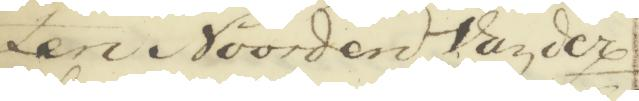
ten Noorden Van der
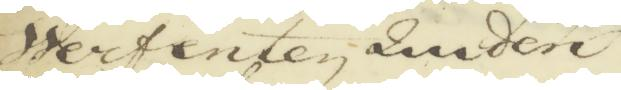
Werfen ten zuiden
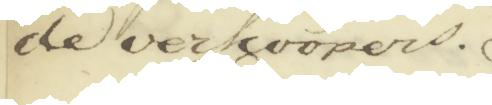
de verkoopers.
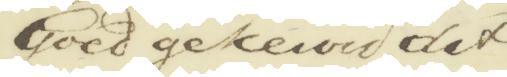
Goed gekeurd dit
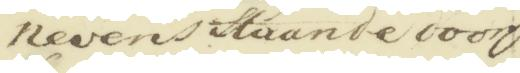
Nevens staande door
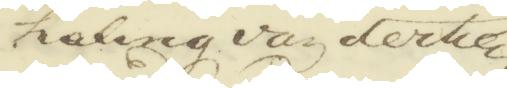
haling van dertien
